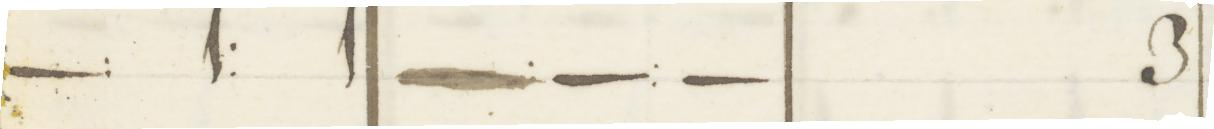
—: 1: 1 —:—:— 3
